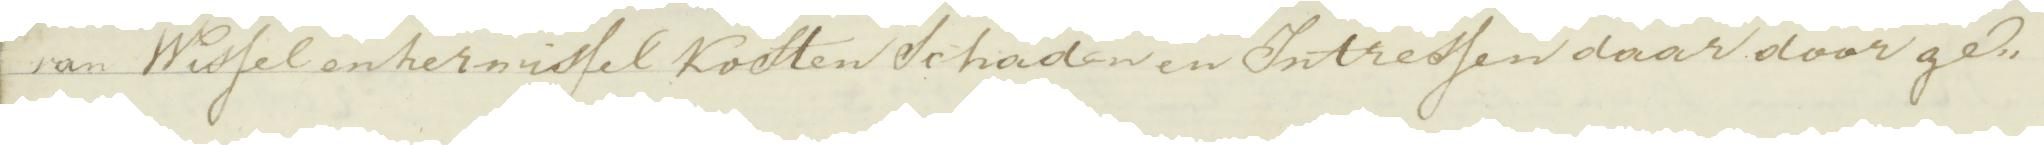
van Wissel en herwissel kosten schaden en Jntressen daar door ge„
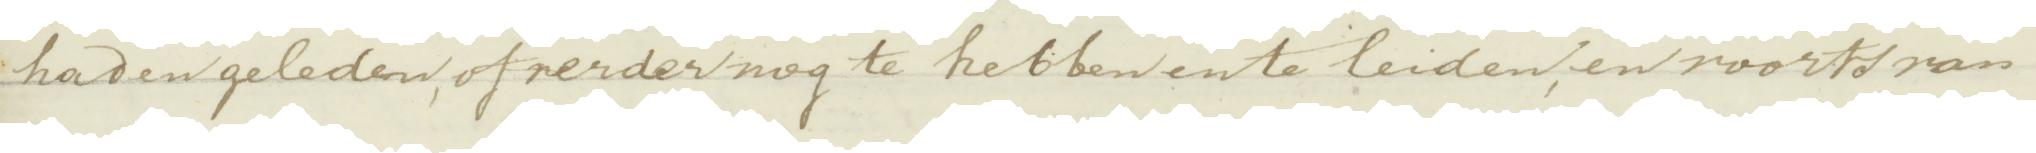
had en geleden, of verder nog te hebben en te leiden, en voorts van
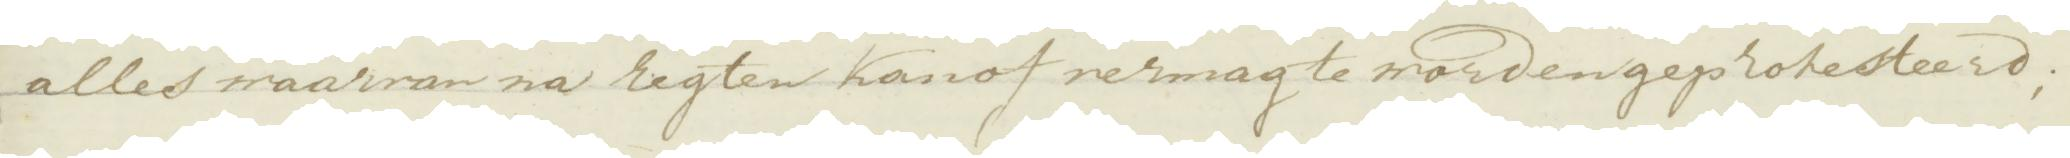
alles waarvan na regten kan of vermag te worden geprotesteerd;
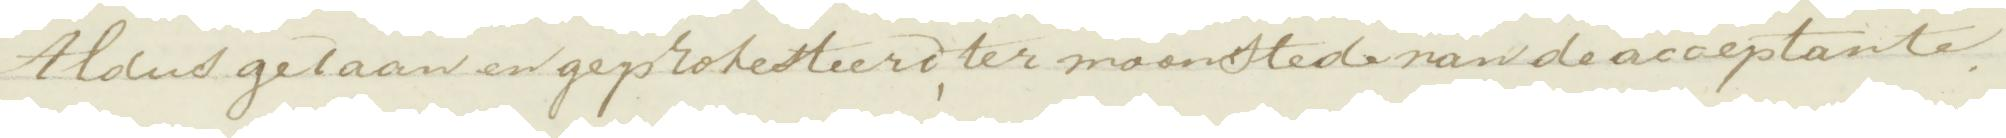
Aldus gedaan en geprotesteerd ter woonstede van de acceptante,
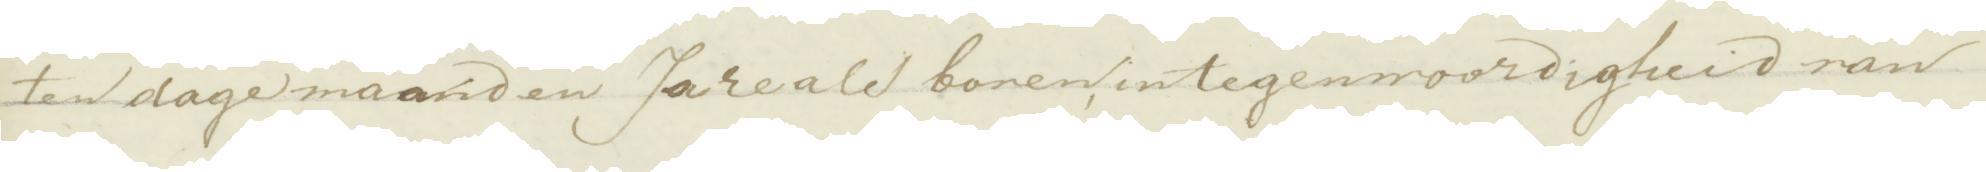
ten dage maand en Jare als boven, in tegenwoordigheid van
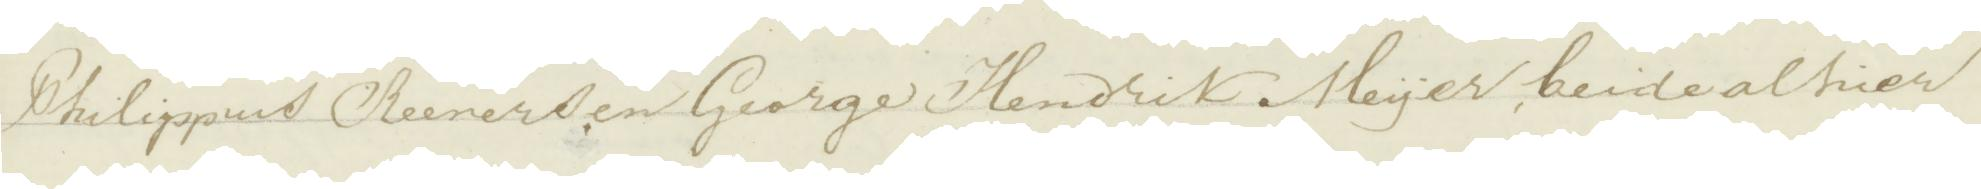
Philippus Reevers en George Hendrik Meijer, beide alhier
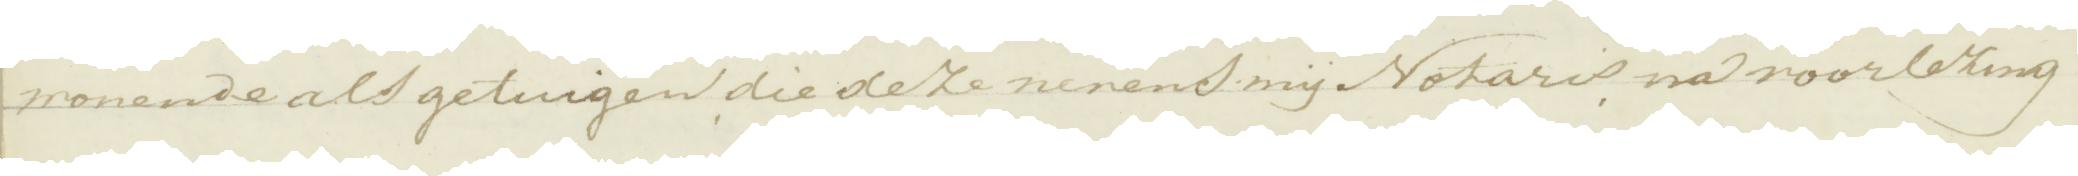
wonende als getuigen die deze nevens mij Notaris na voorlezing
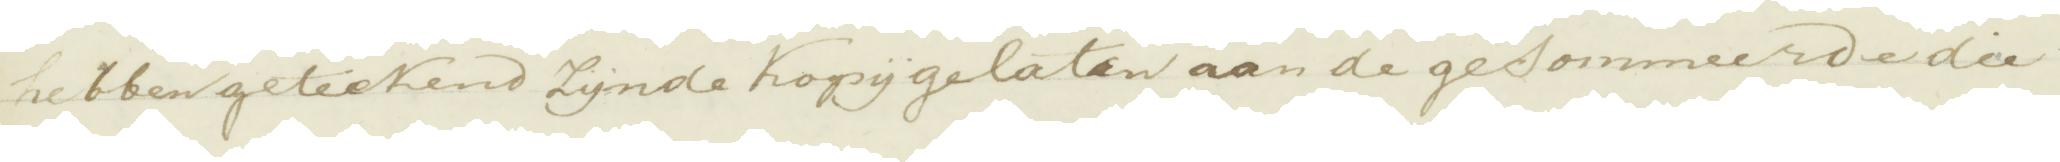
hebben geteekend zijnde kopij gelaten aan de gesommeerde die
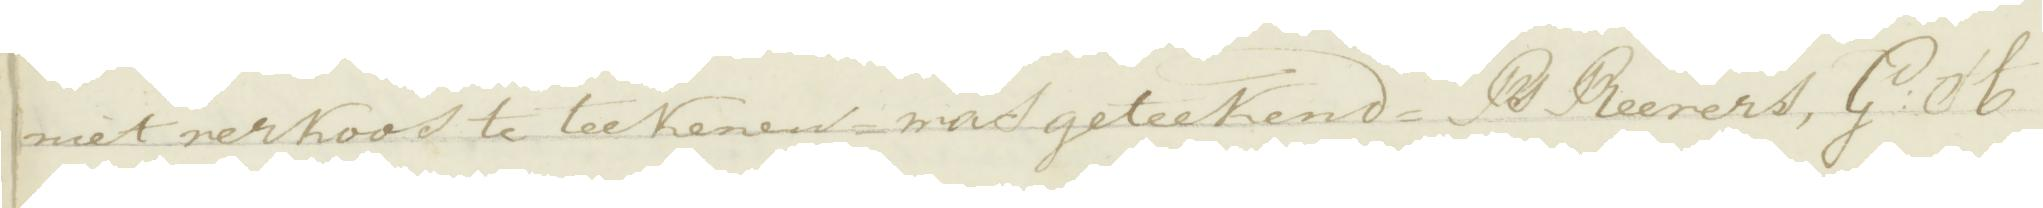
niet verkoos te teekenen = was geteekend = Ps Reevers, G:H
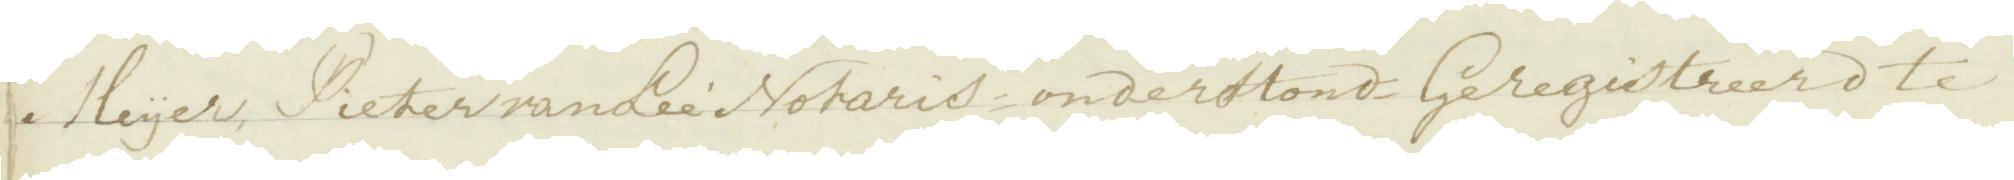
Meijer, Pieter van Leé Notaris = onderstond = Geregistreerd te
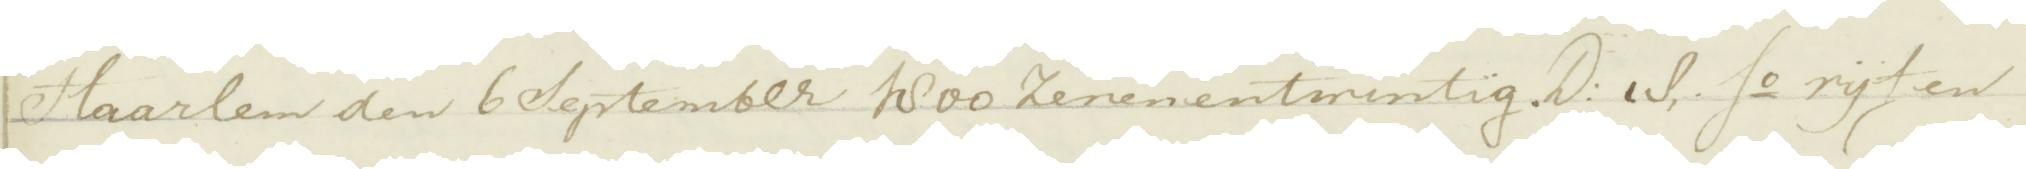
Haarlem den 6 September 1800 zevenentwintig D: 18, f=o vijf en
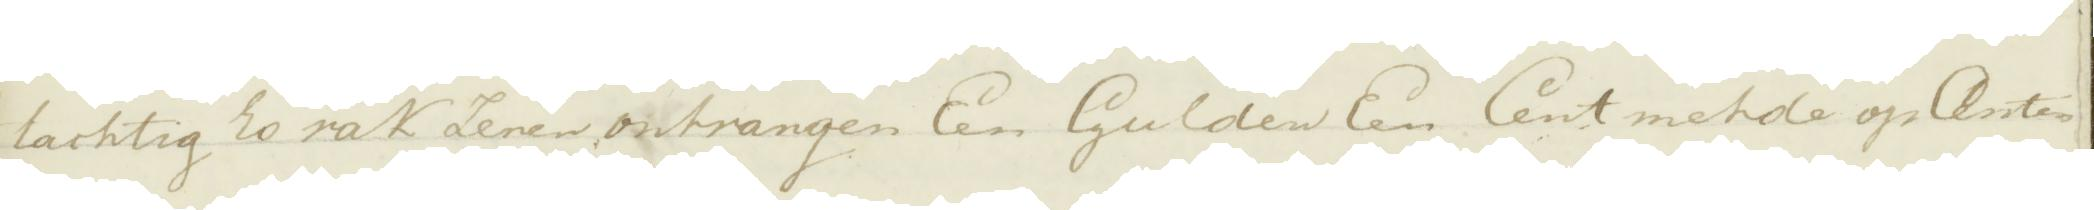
tachtig ho vak zeven, ontvangen Een Gulden Een Cent met de op Centen
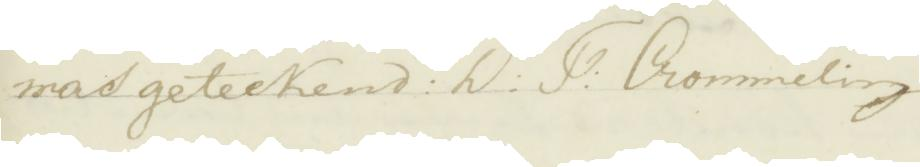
was geteekend: D: F: Crommelin
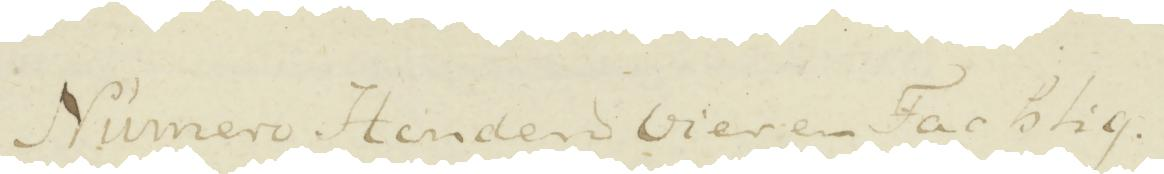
Numero Honderd Vier en Tachtig.
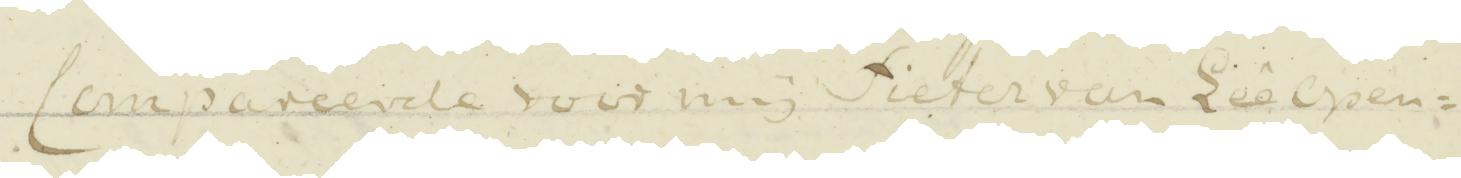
Compareerde voor mij Pieter van Leê Open=
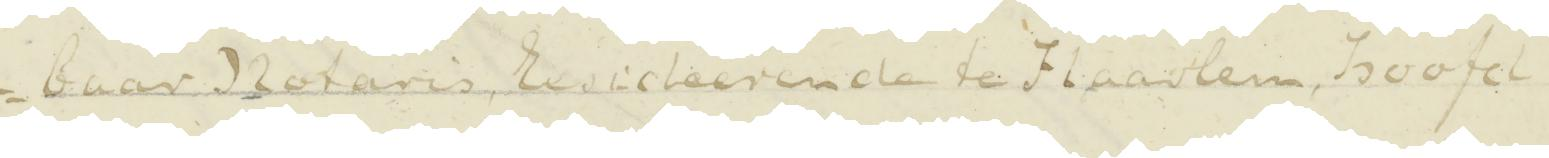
=baar Notaris, Resideerende te Haarlem, hoofd
